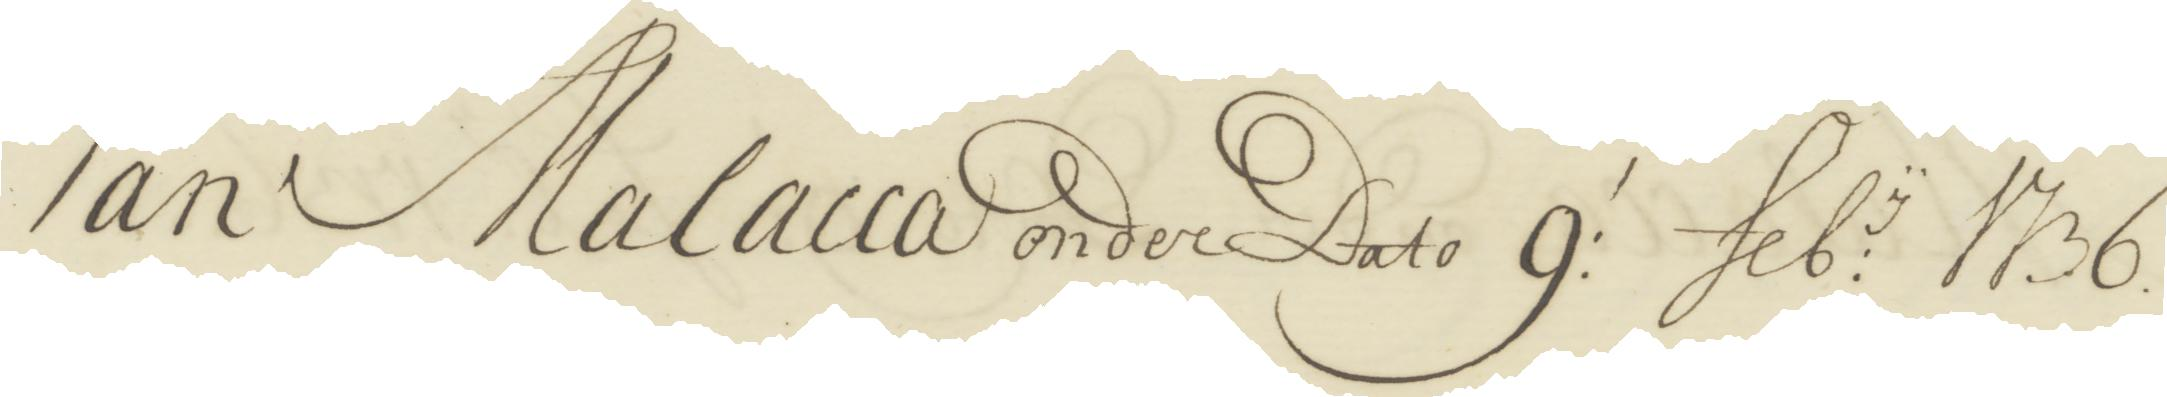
Van Malacca onder Dato 9:' feb:ij 1736.
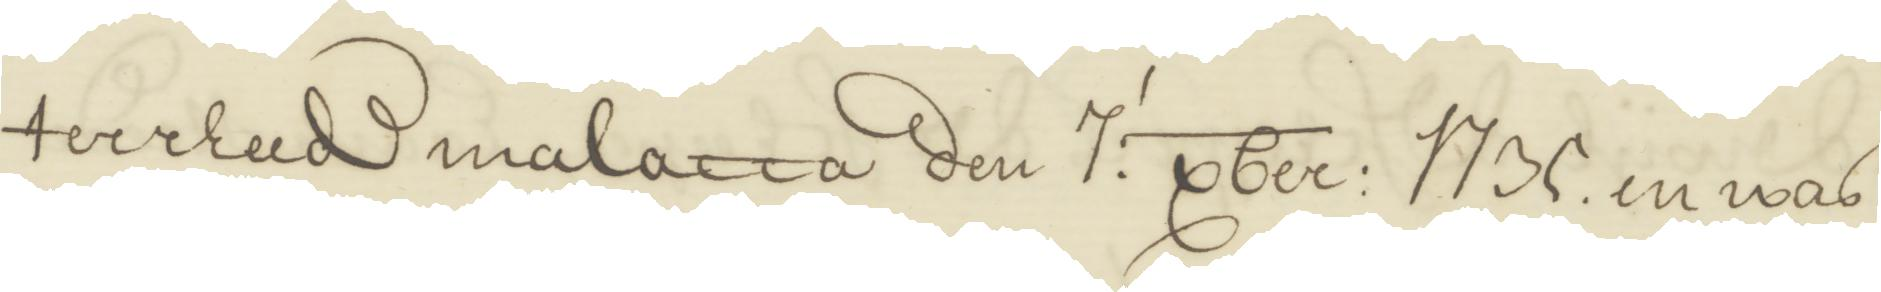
terrheede malacca den 7:' xber: 1735. en was
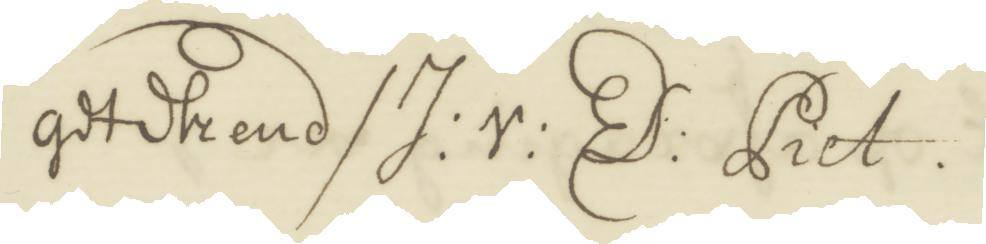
getekend /J: v: D: Piet.
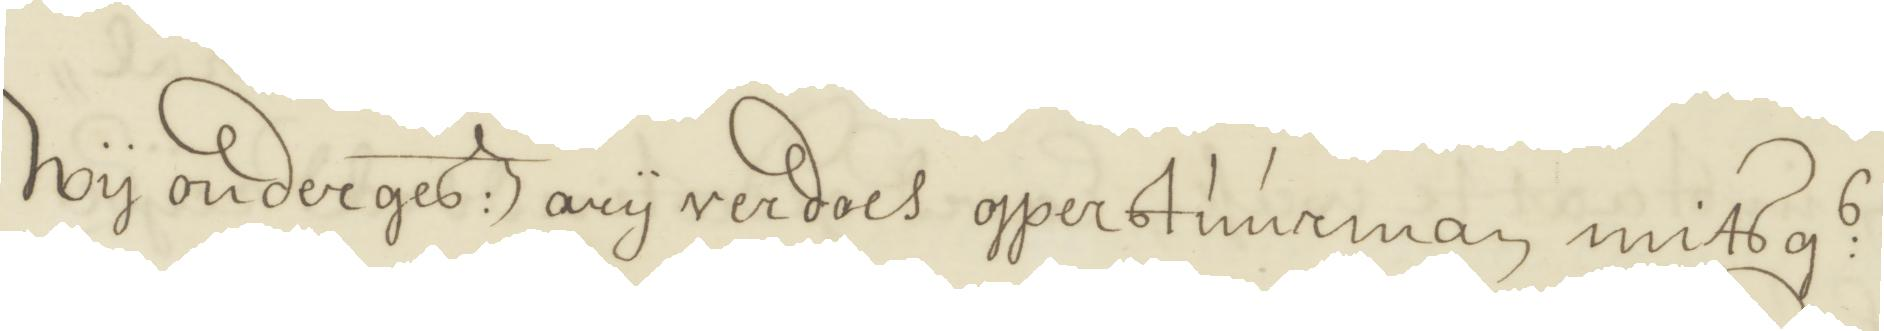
wij onderget:n arij verdoes opperstuurman mitsg:s
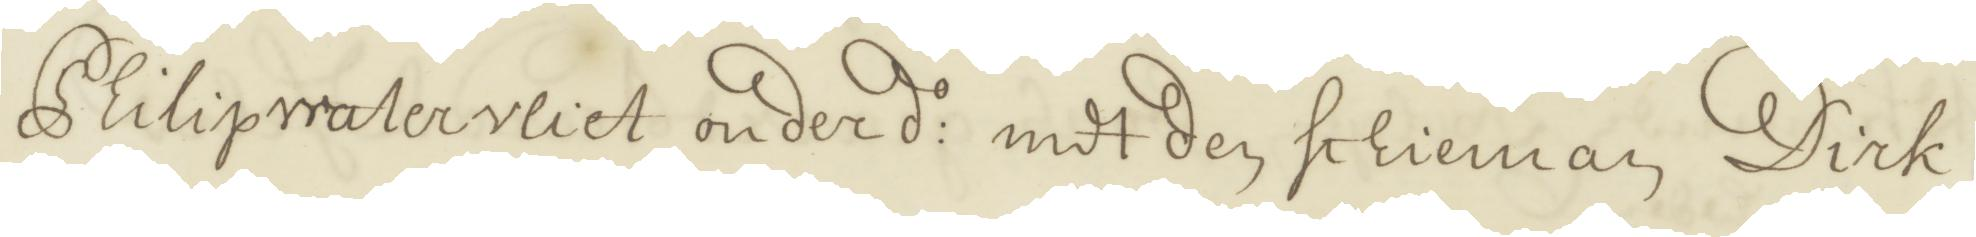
Philip watervliet onder d:o met den schieman Dirk
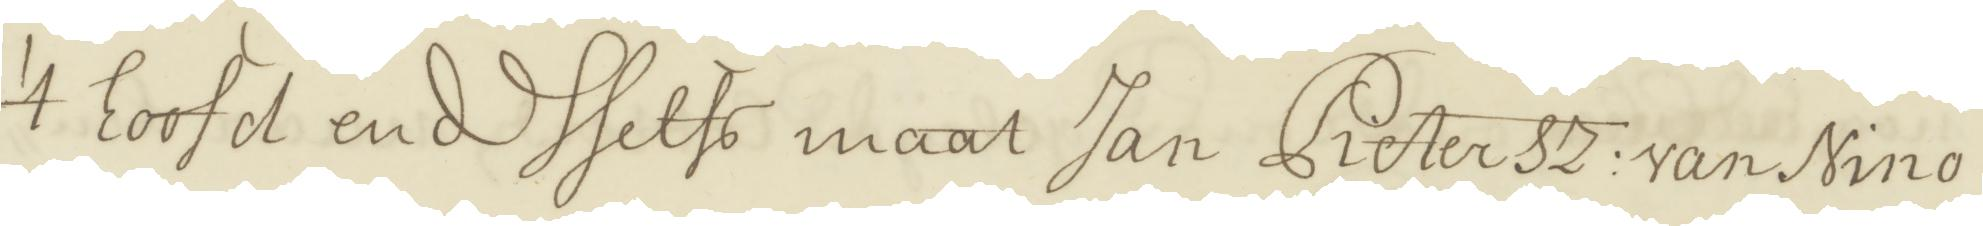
’t hoofd en desselfs maat Jan Pietersz: van Nino
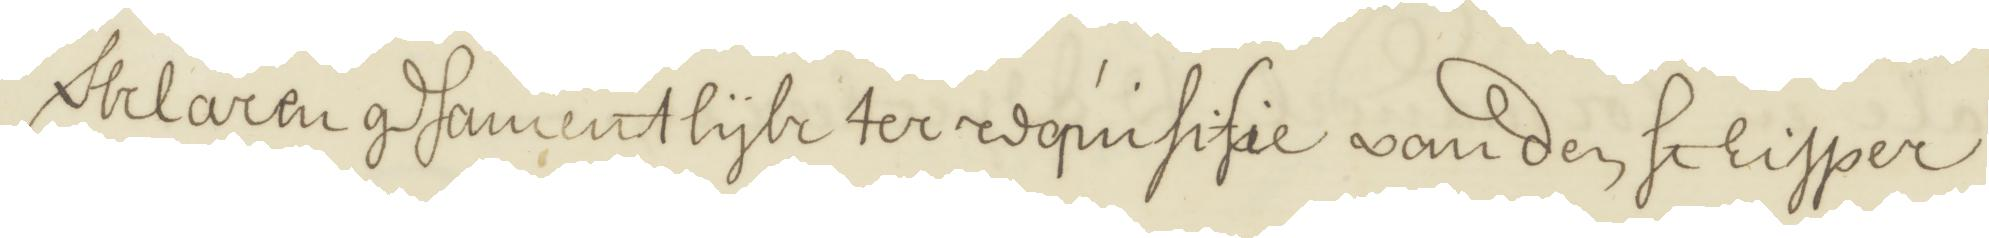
verklaren gesamentlijk ter requisisie van den schipper
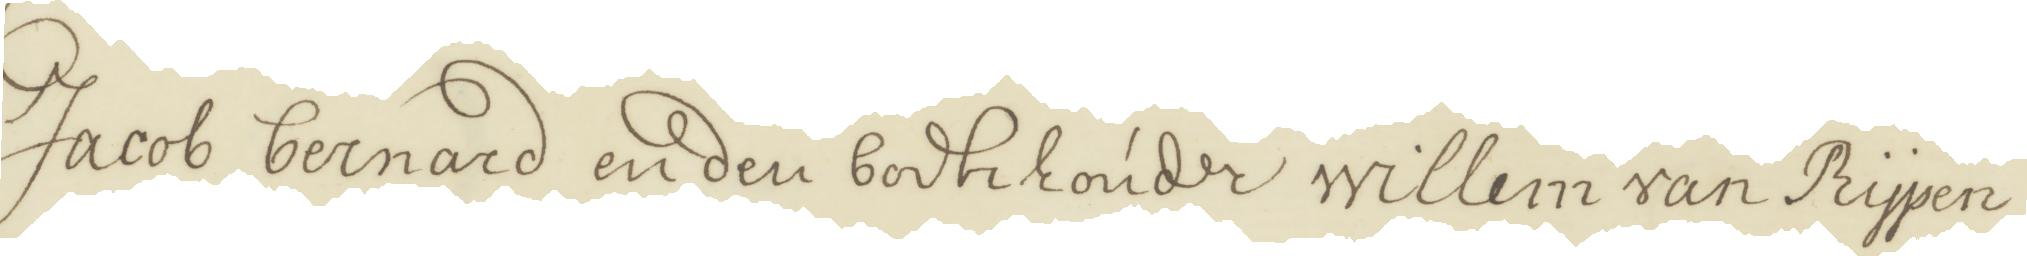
Jacob bernard en den boekhouder willem van Rijpen
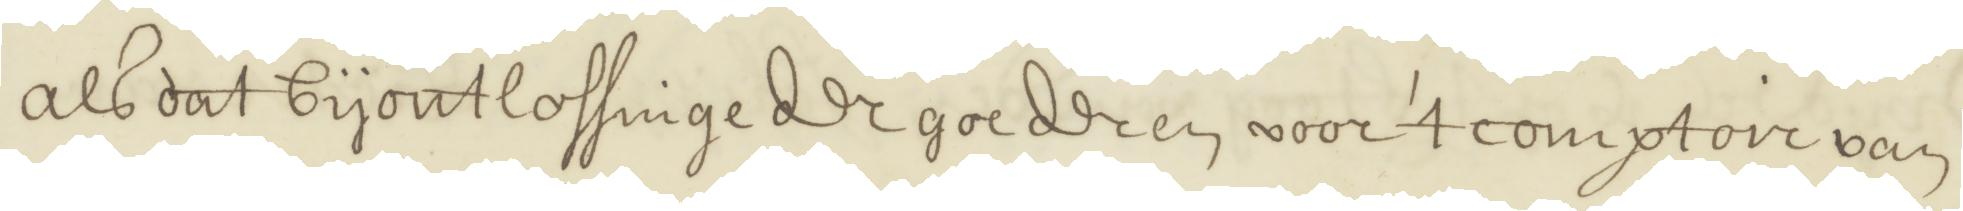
als dat bij ontlossinge der goederen voor ’t comptoir van
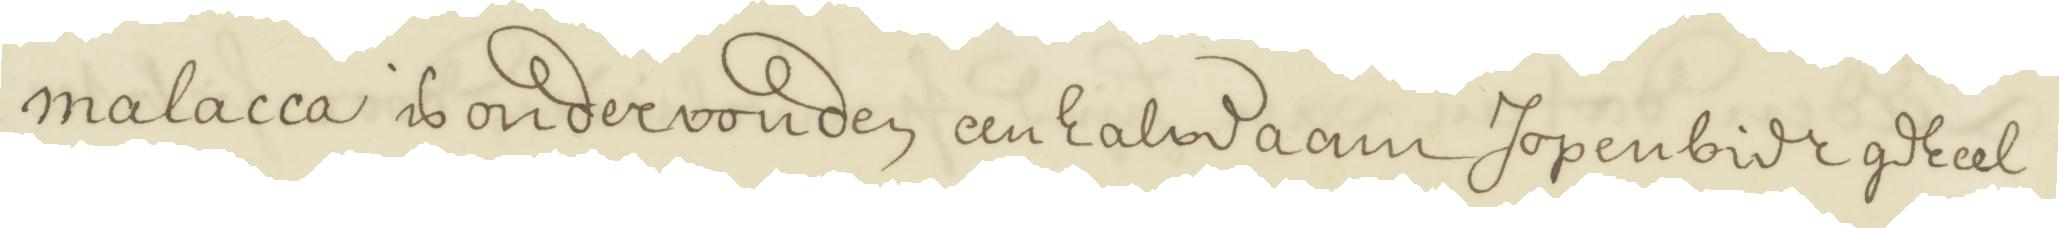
malacca is ondervonden een halve aam Jopenbier geheel
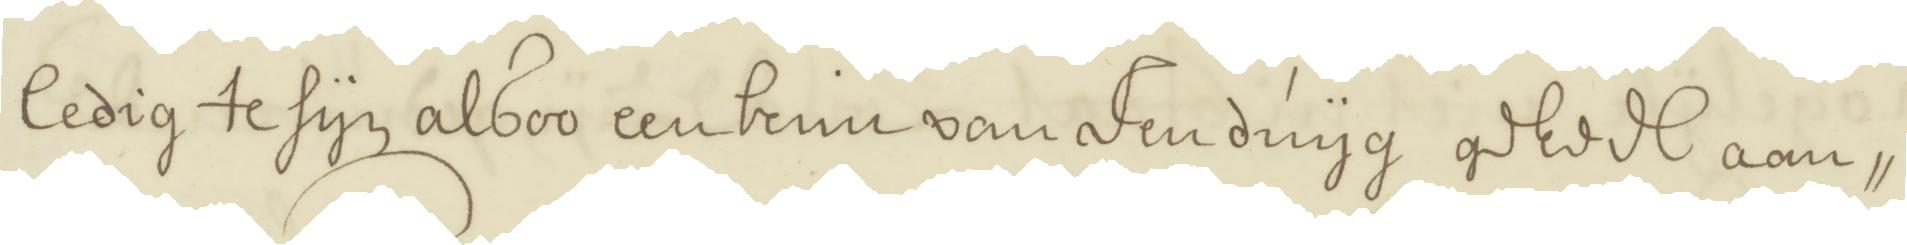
ledig te sijn alsoo een kim van Een duijg geheel aan„
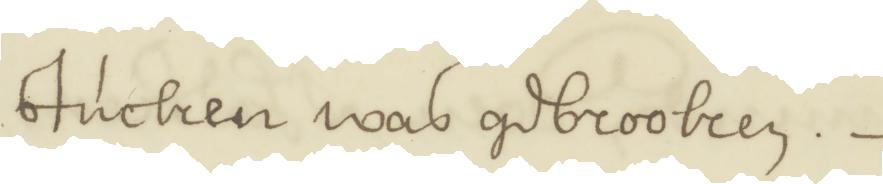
stucken was gebrooken. —
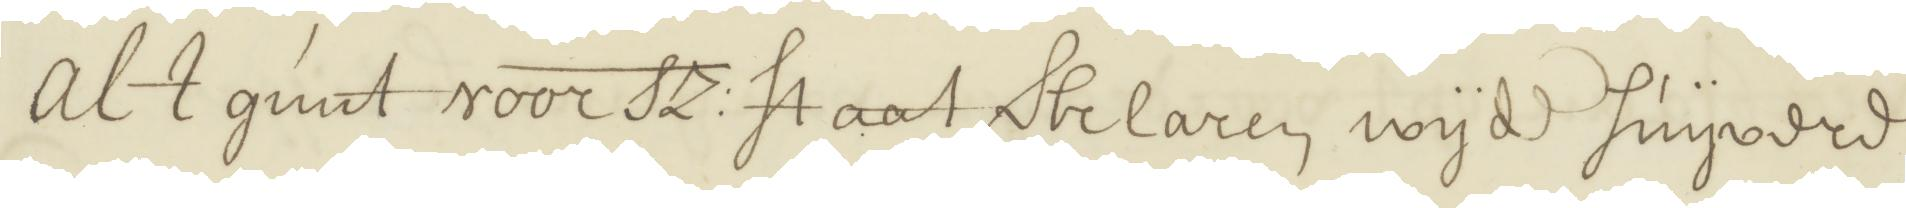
al ’t gunt voorsz: staats verklaren wij de suijvere
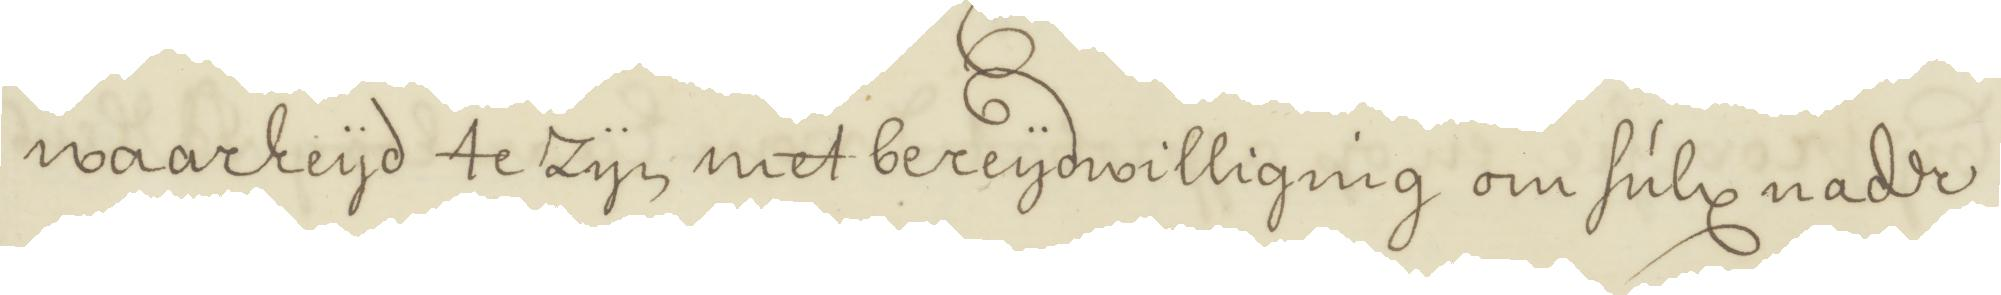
waarheijd te zijn met bereijdwilliging om sulx nader
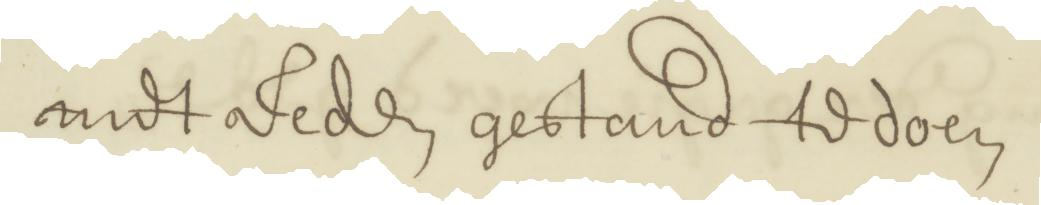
met Eeden gestand te doen. —
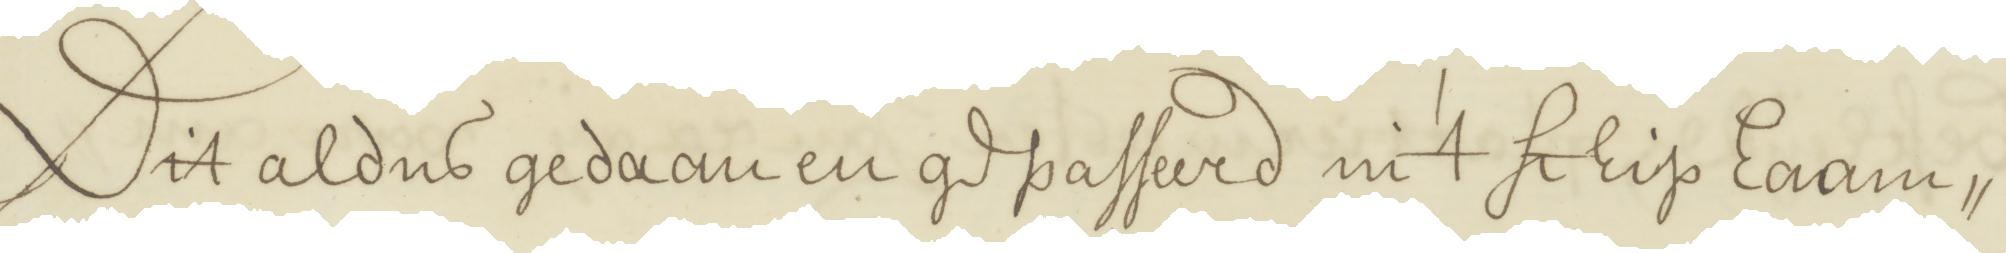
Dit aldus gedaan en gepasserd in ’t schip haam„
